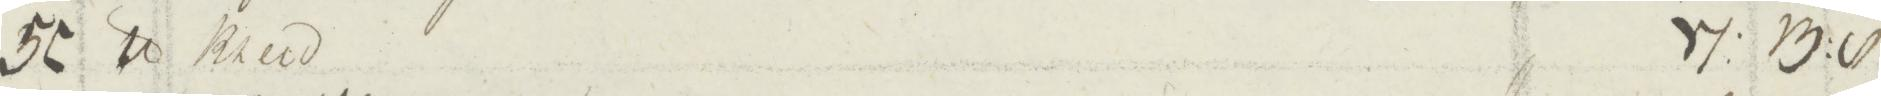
55 lb Reed „ 17:13:8
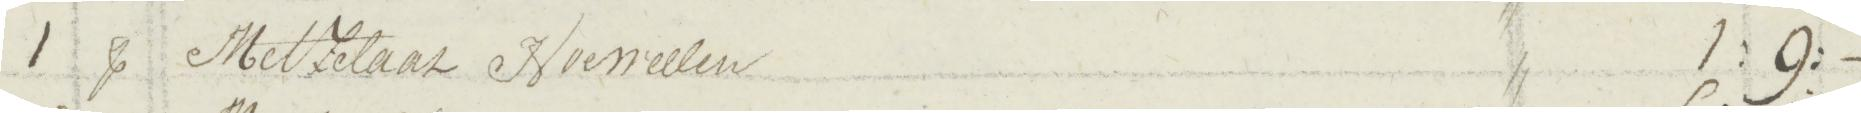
1 p Metzelaar Hoeweelen „ 1:9:—
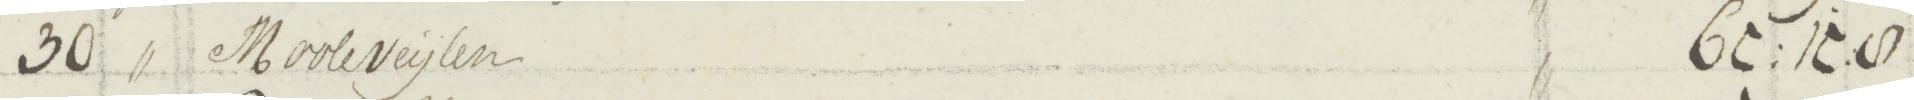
30 „ Mooleveijlen „ 65:15:8
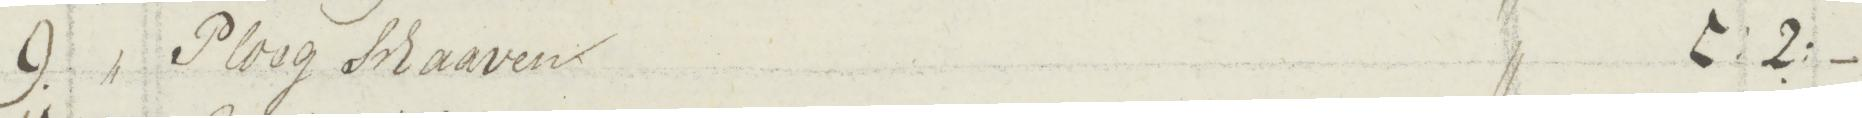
9. „ Ploeg schaaven „ 5:2:—
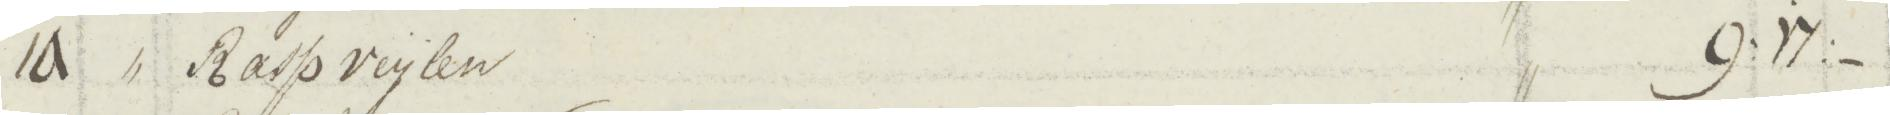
14 „ Rasp veijlen „ 9: 17:—
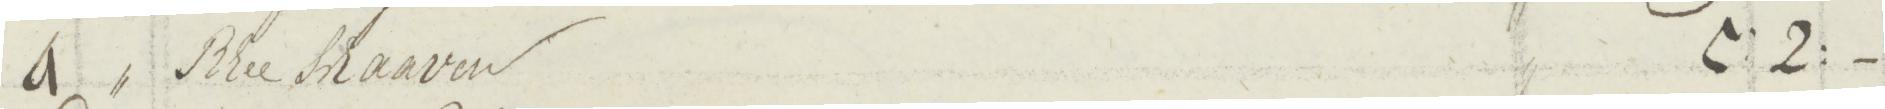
4. „ Rhee schaaven „ 5. 2:—
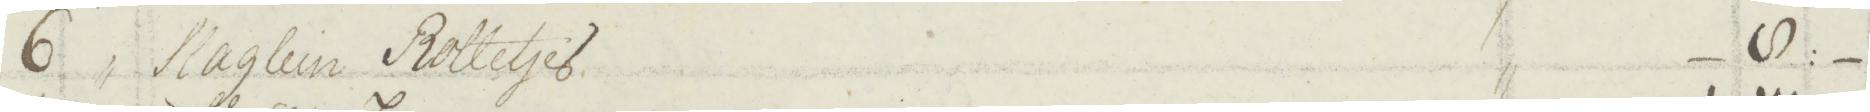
6. „ slagleijn Rolletjes „ 8:—
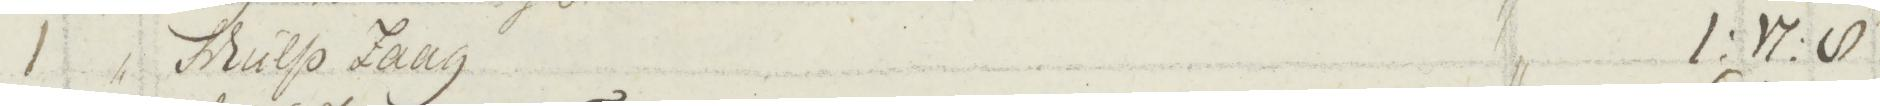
1 „ schulp zaag „ 1:17:8
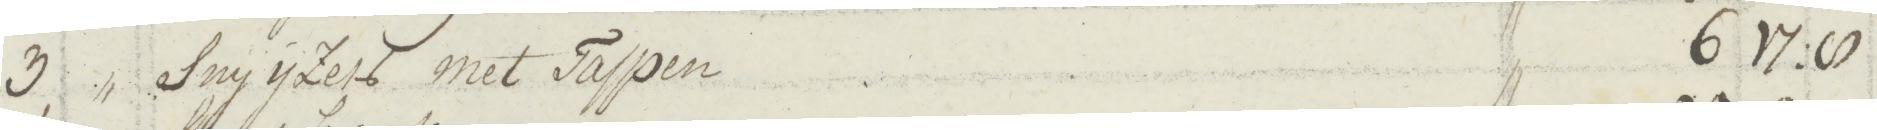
3 „ snij ijzers met Tappen „ 6:17:8
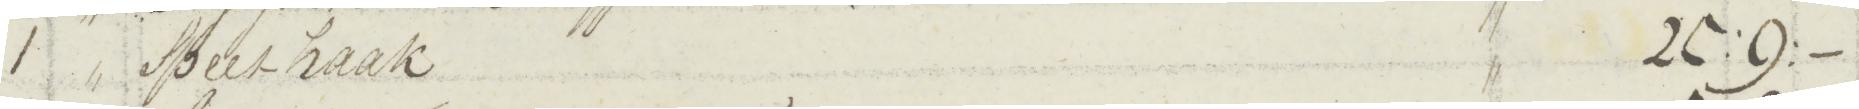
1 „ speer haak „ 25:9:—
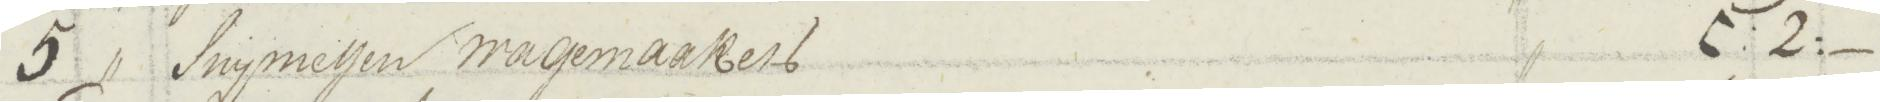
5 „ snijmeyen wagemaakers „ 5:2:—
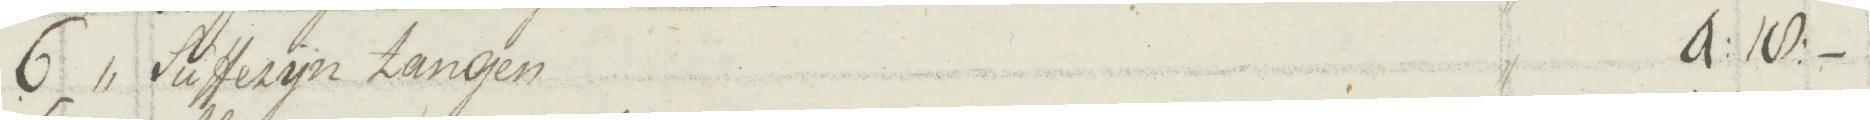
6 „ sufferijn tangen „ 4:18:—
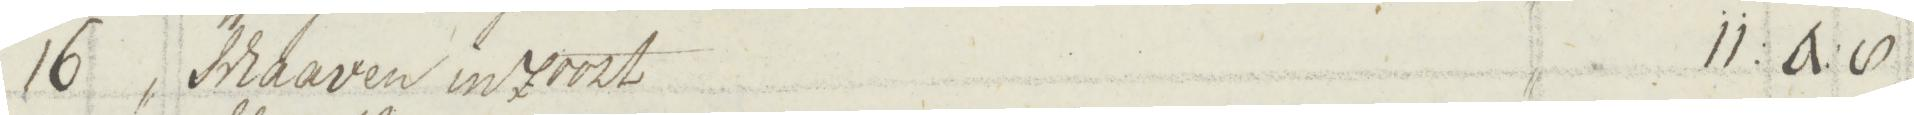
16 „ schaaven in zoort „ 11:4:8
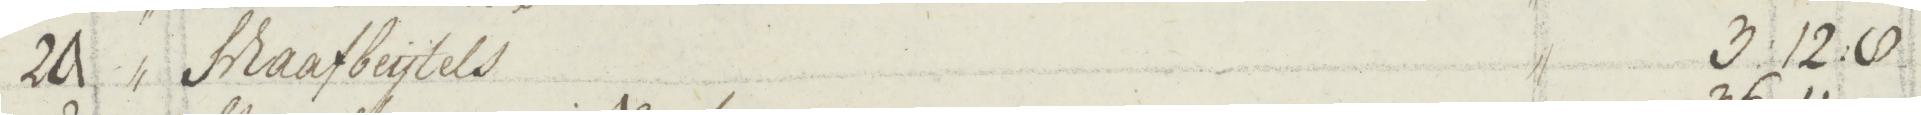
24 „ schaafbeijtels „ 3:12:8
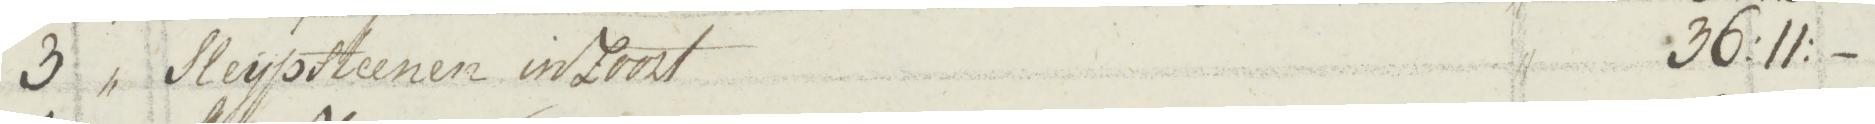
3 „ sleijpsteenen in zoort „ 36:11:—
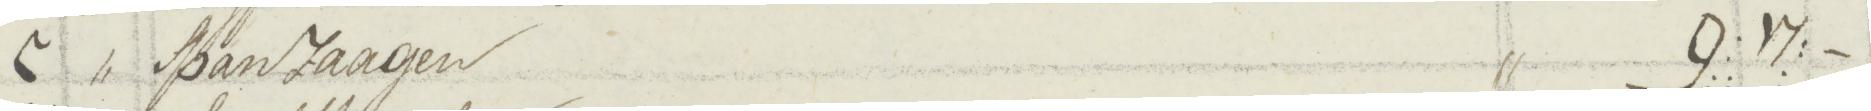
5 „ spanzaagen „ 9:17:—
